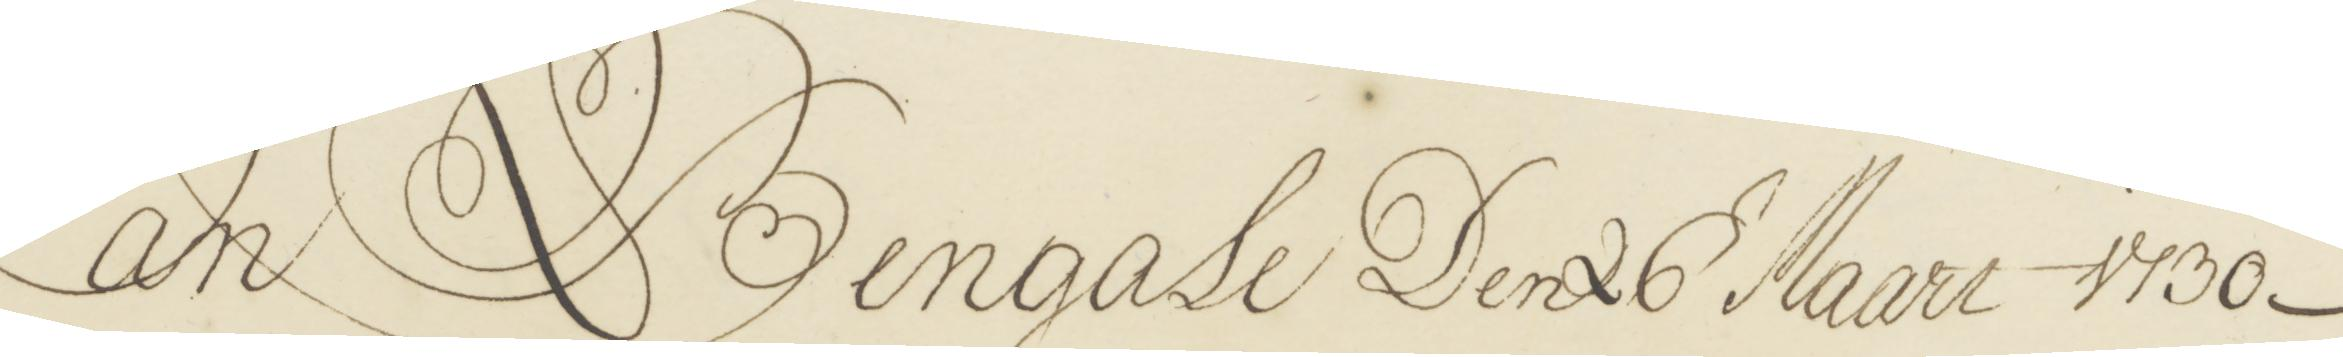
Van Bengale Den 26' Maart 1730—
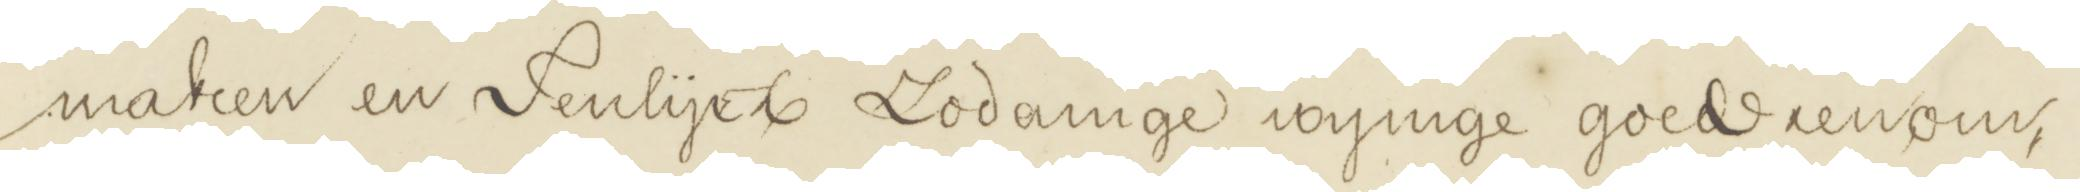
maken en Eenlijck zodanige wynige goederen om„
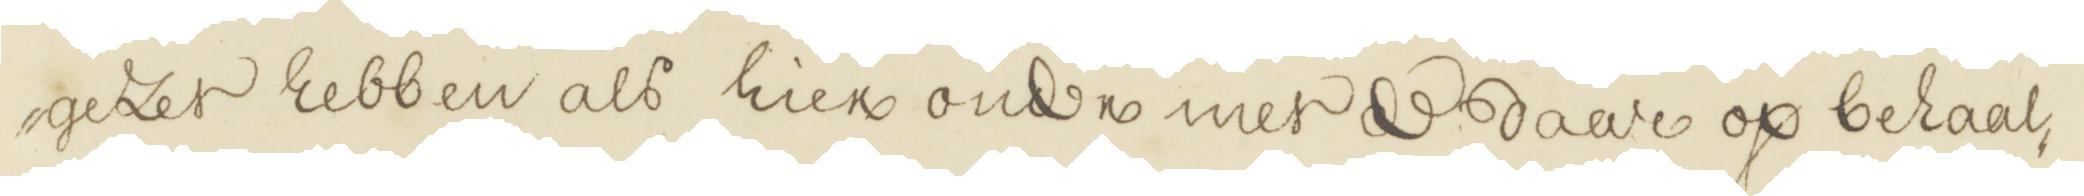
„gezet hebben als hier onder met de daar op behaal„
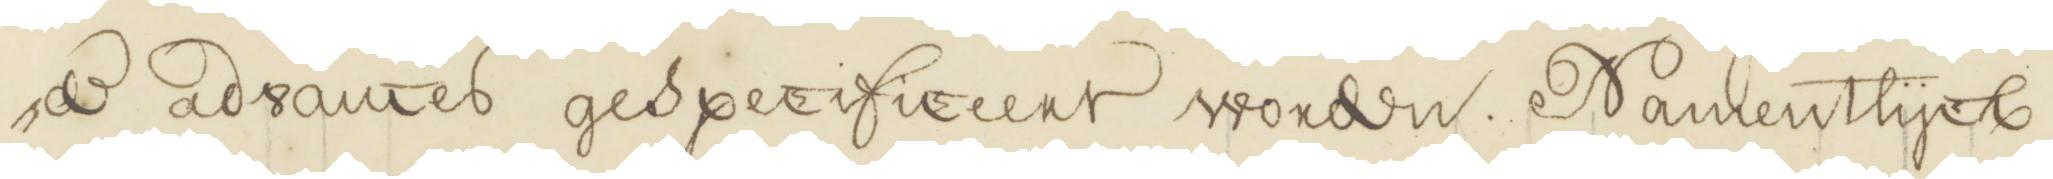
„de advances gespecificeert worden. Namentlijck
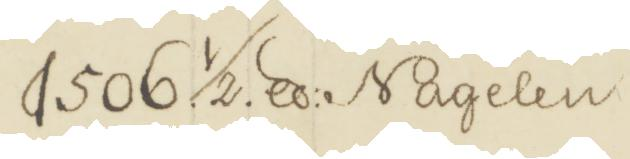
4506.½. lb: Nagelen
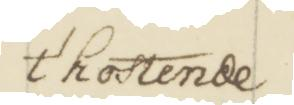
t' kostende
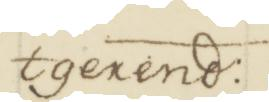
tgerend:
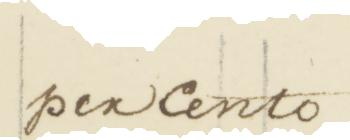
per Cento
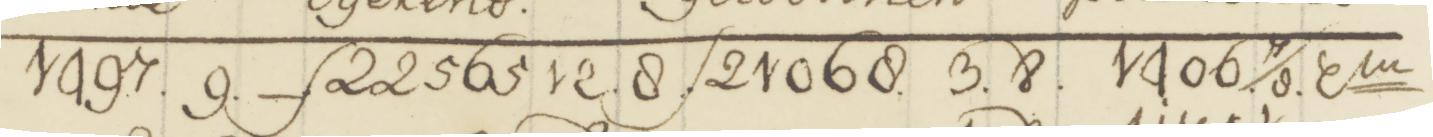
ƒ1497.9.— ƒ22565.12:8. ƒ21068.3.8. 1406. 7/8. r=m
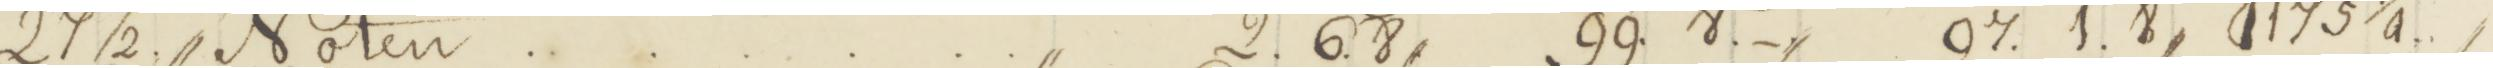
27½. „ Noten . . . . . . „ 2. 6. 8„ 99. 8.—„ 97. 1. 8„ 1175¼
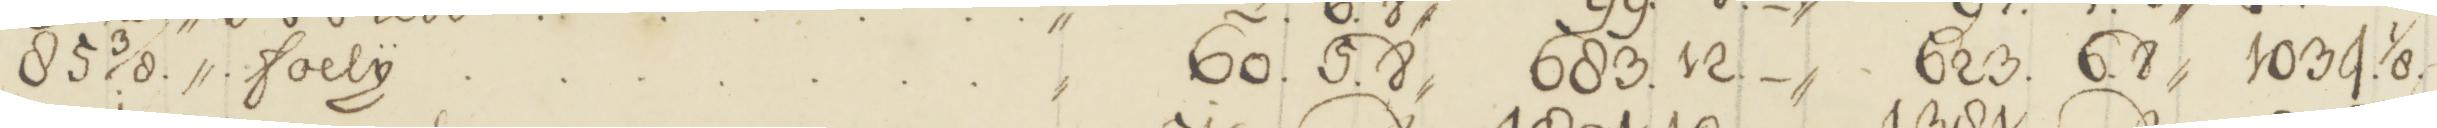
85 3/8. „. foelij . . . . . . . „ 60. 5. 8„ 683.12.—„ 623. 6. 8„ 1034. 1/8.
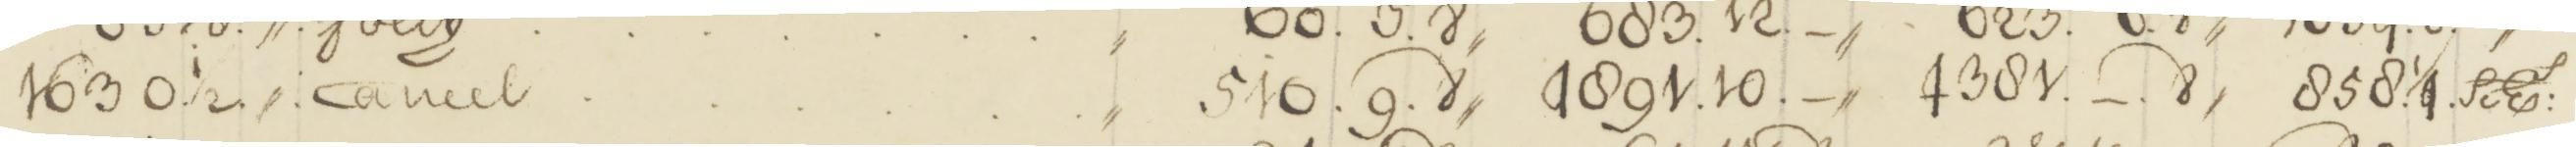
1630.½. „:caneel . . . . . . „ 510. 9. 8„ 4891.10. „ 4381.—.8„ 858.¼. sch:s
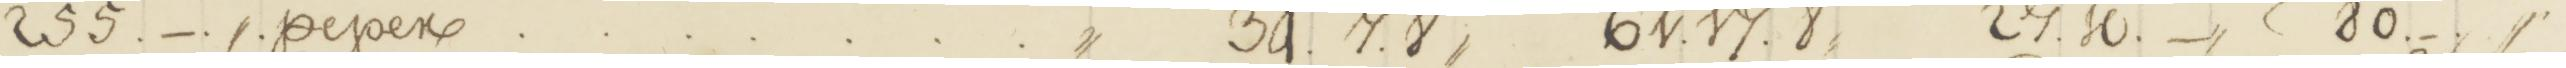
255 .—. „. peper . . . . . . . „ 34. 7. 8„ 61. 17. 8„ 27.10. —„ 80.
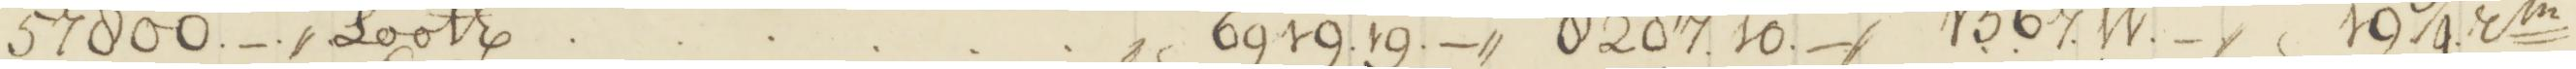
57800.—.„ Looth . . . . . . „6919. 19. —„ 8287:10.—„ 1367.11.— „ 19¾. r=m
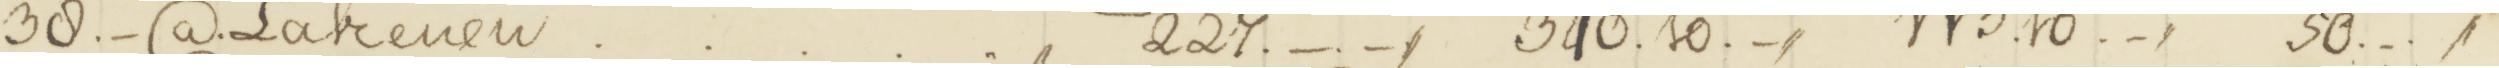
38.— @. Lakenen . . . . . „ 227.—.—„ 340. 10.—„ 113.10.—„ 50.—. „
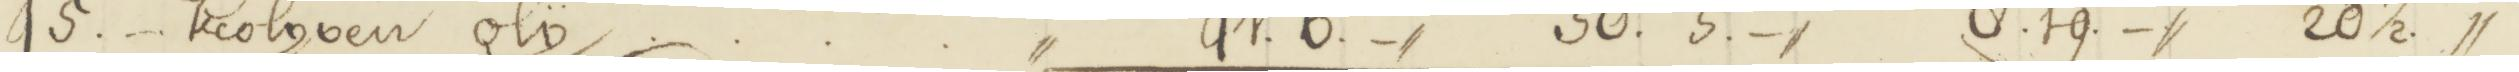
45.—. kolyven olij . . . . „ 41. 6.—„ 50. 5.–„ 8.19.—„ 20½. „
